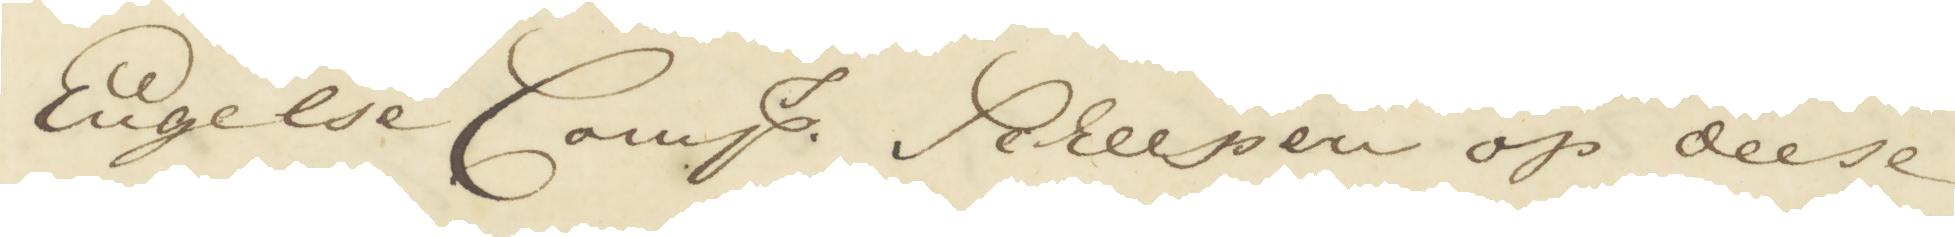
Engelse Comp:s scheepen op deese
